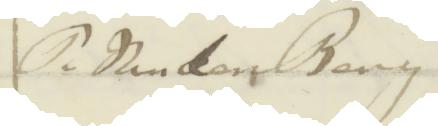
P. Van den Berg
